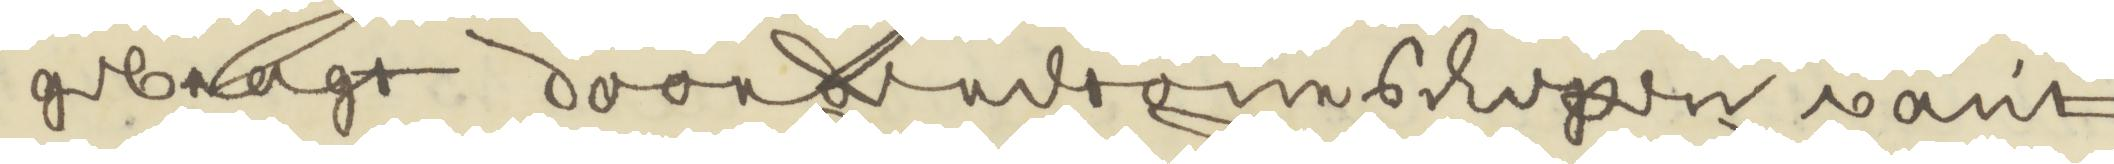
gebragt door de retourschepen van’t
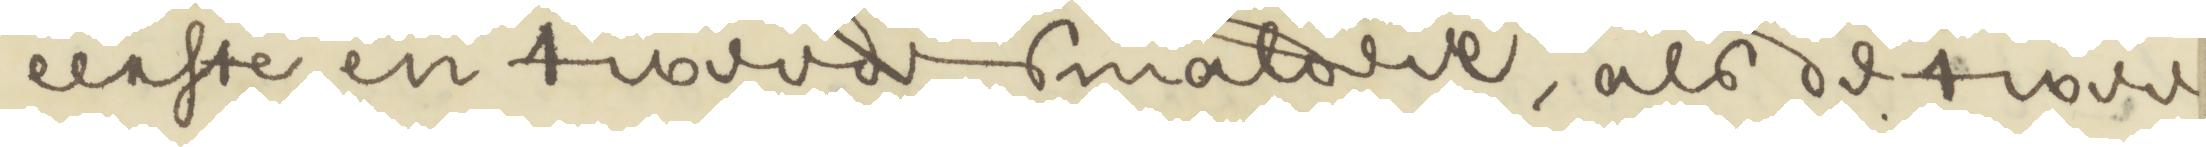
eerste en tweede smaldeel, als de twee
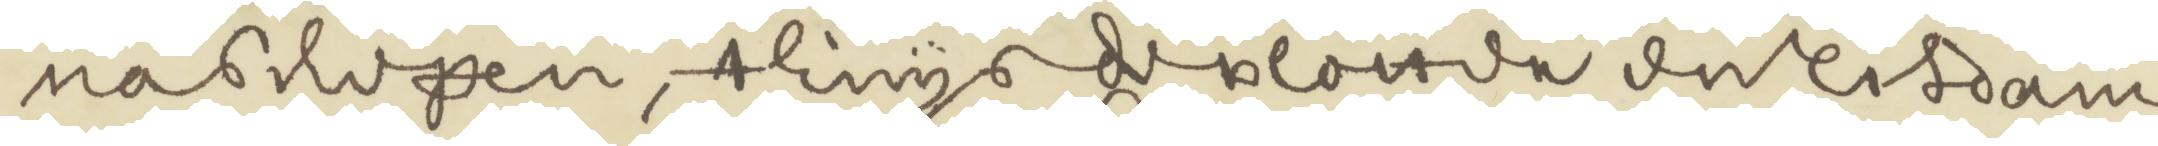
naschepen, thuijs de vlooter en risdam
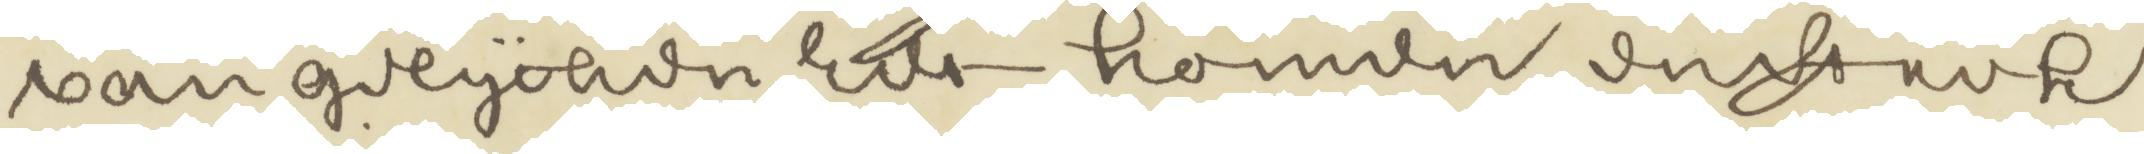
van gelijcken het komen en vertrek
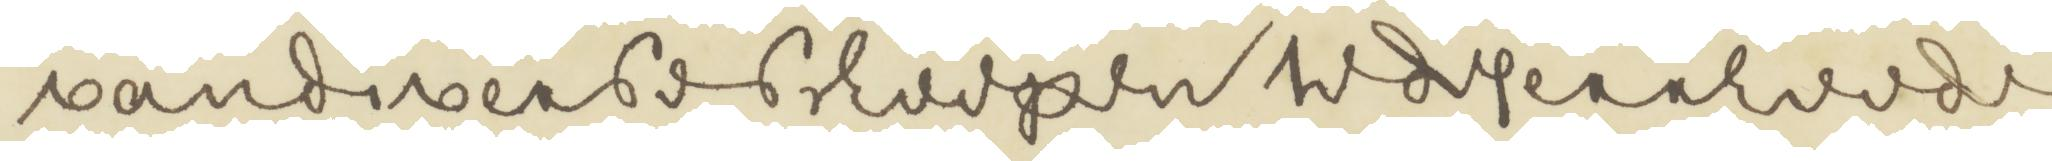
van diverse scheepen te deser rheede
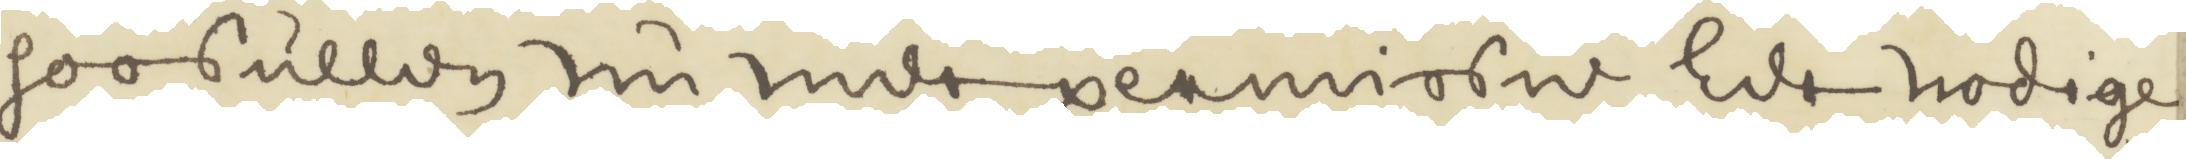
soo sullen nu met permissie het nodige
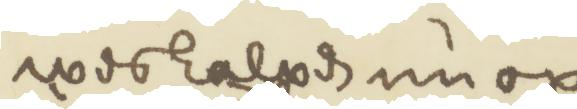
weshalven nu op
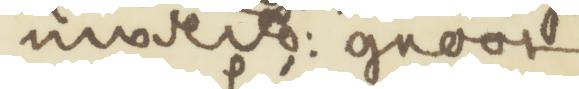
uwel ed: groot
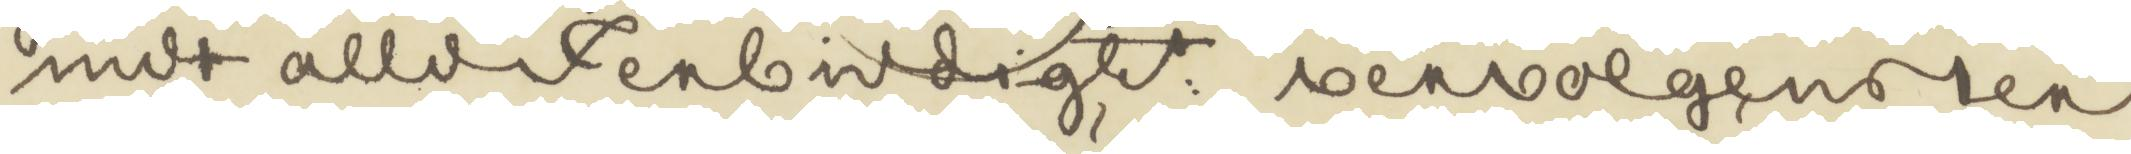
met alle Eerbiedigh:t vervolgens ter
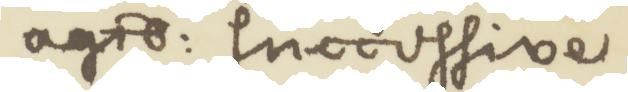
agtb: successive
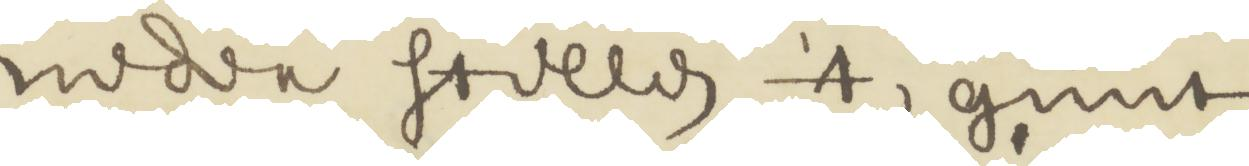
neder stellen t, gunt
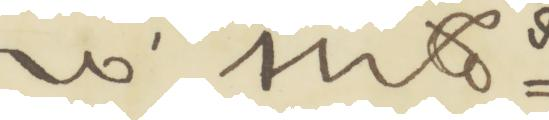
w' UEd=s
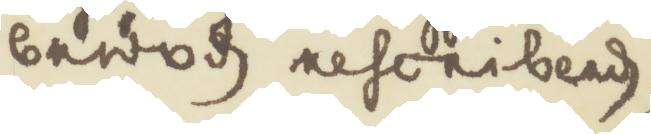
brieven rescriberen
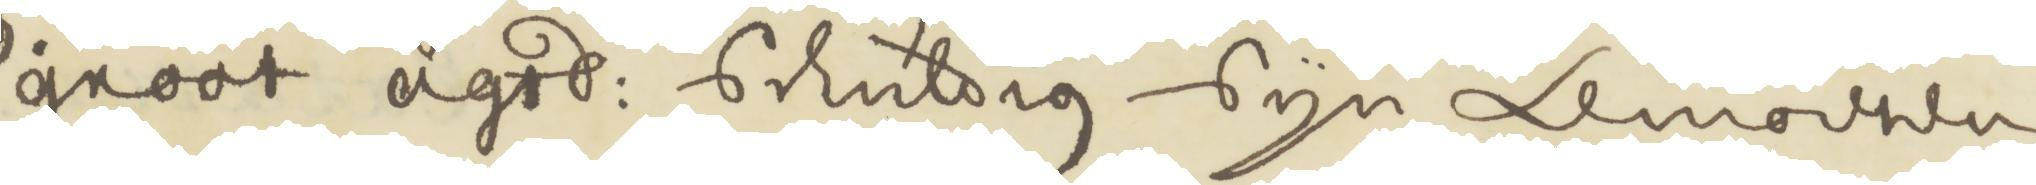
groot agtb: schuldig sijn te moeten
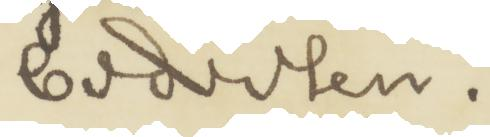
bedeelen.
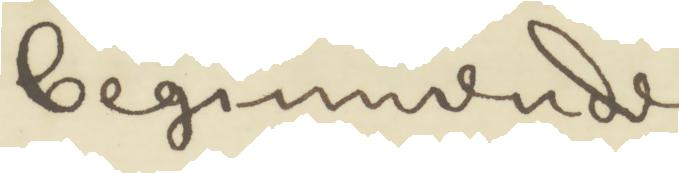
beginnende
